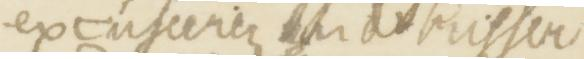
excuseeren en de Kisser
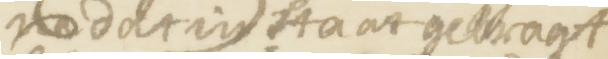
na dat in staat gebragt
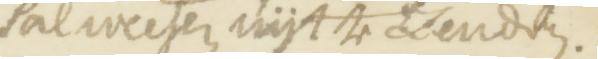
Sal weesen uijt te Zenden.
